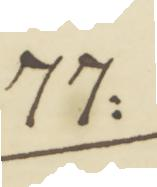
77:
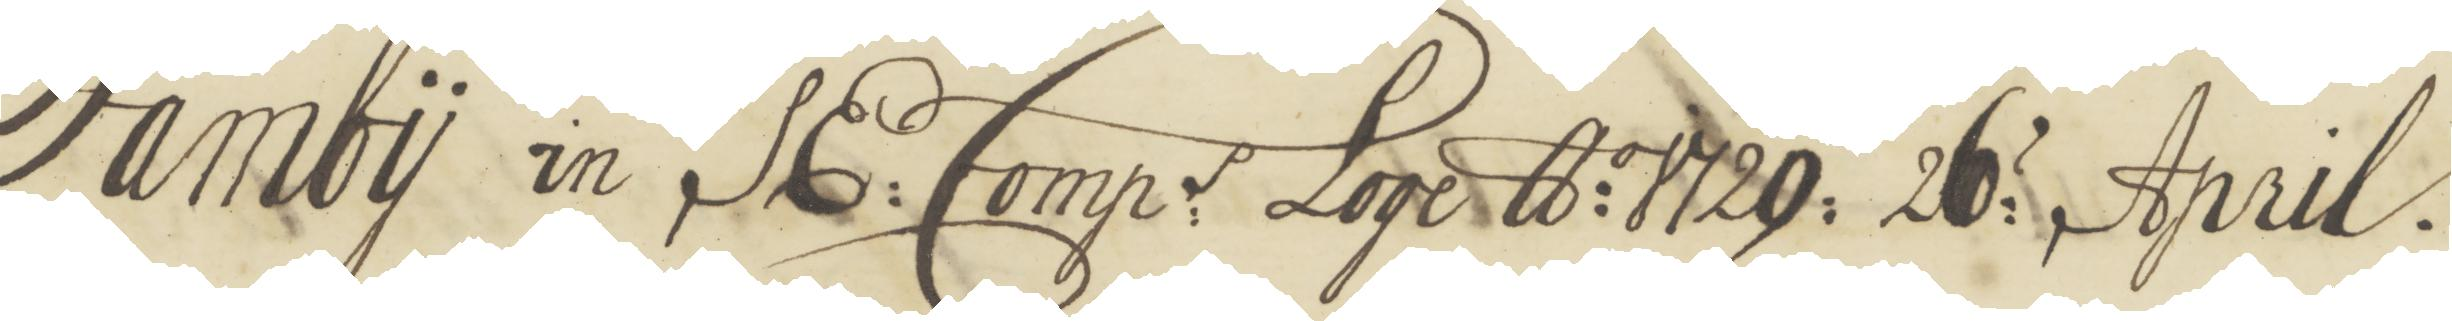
Jambij in 'SE: Comp:s Loge A:o 1729: 26:' April.
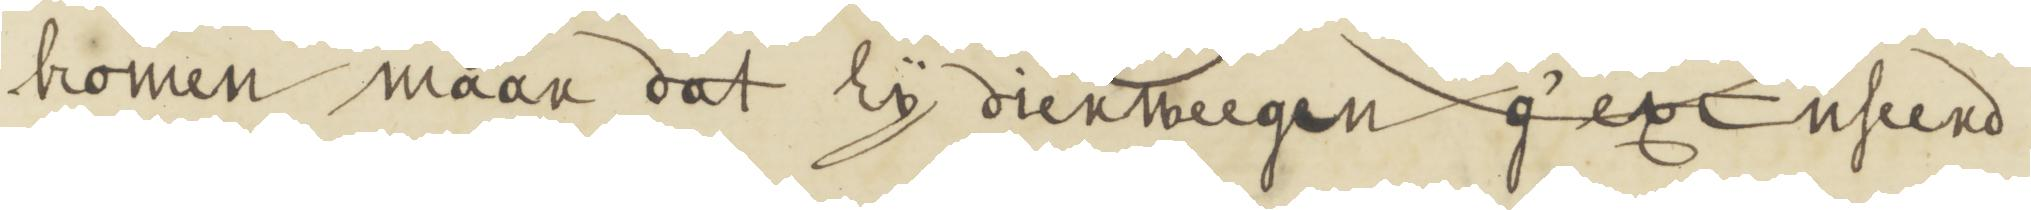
komen maar dat hij dierweegen g’excuseerd
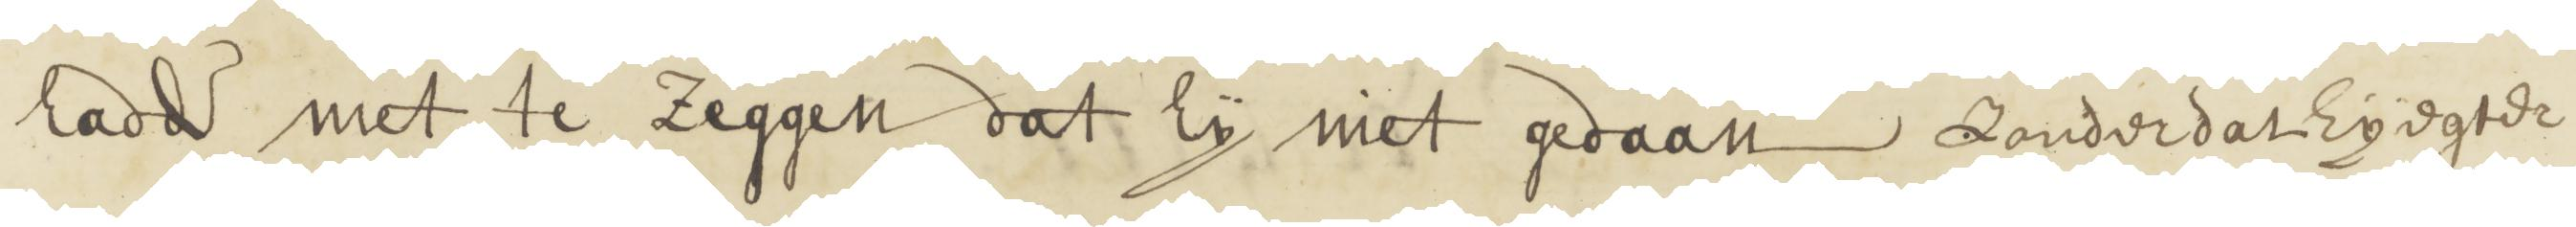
hadde met te zeggen dat hij niet gedaan zonder dat hij egter
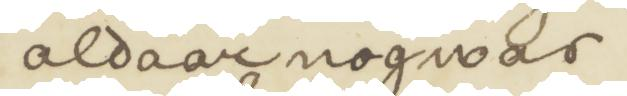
aldaar nog was
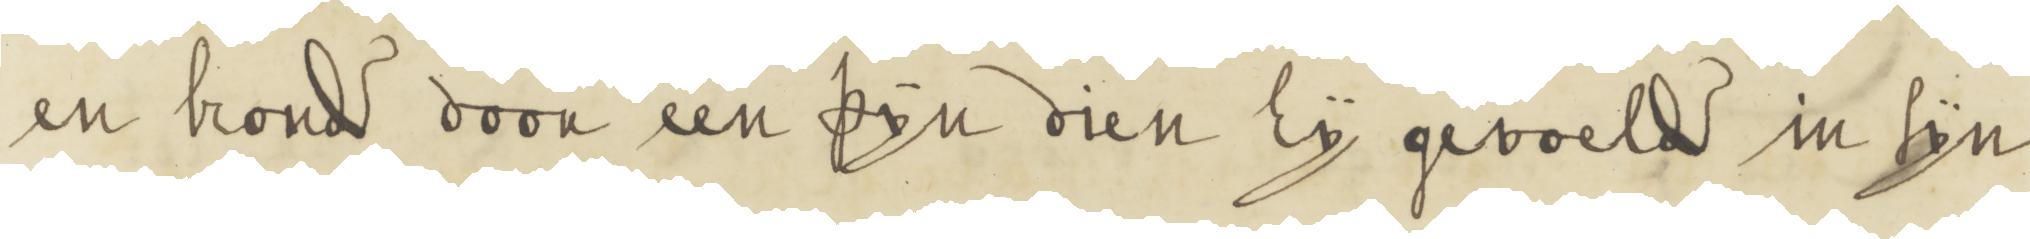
en konde door een pijn dien hij gevoelde in sijn
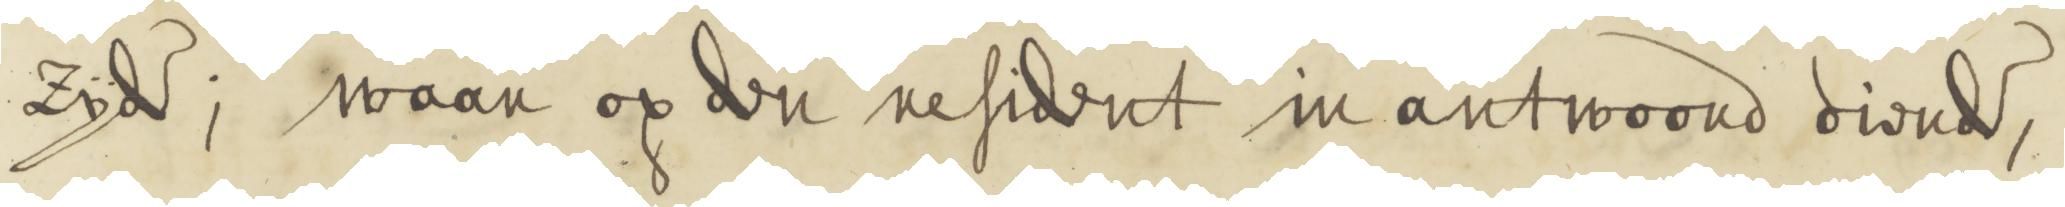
zijde; waar op den resident in antwoord diende,
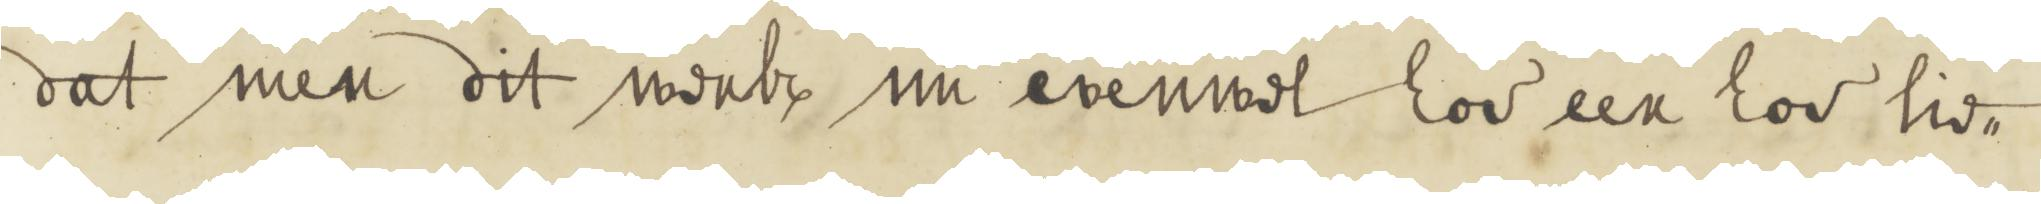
dat men dit werk nu evenwel hoe eer hoe lie„
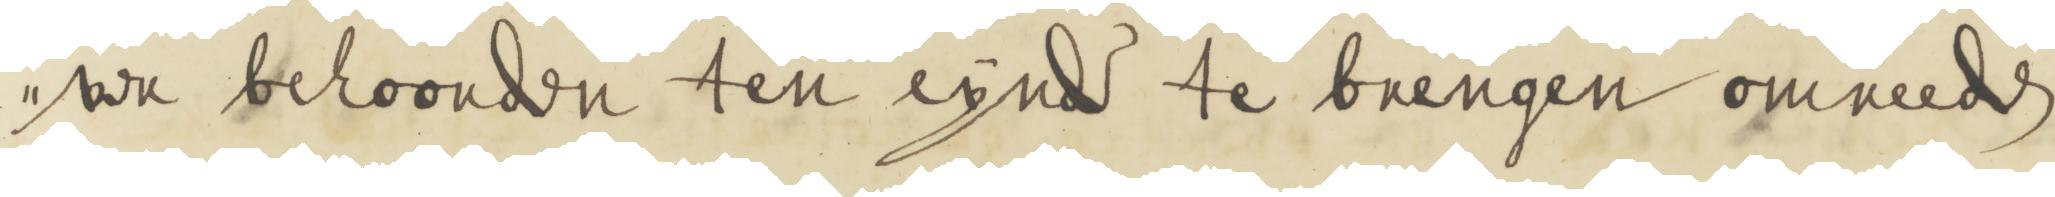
„ver behoorden ten eijnde te brengen om reeden
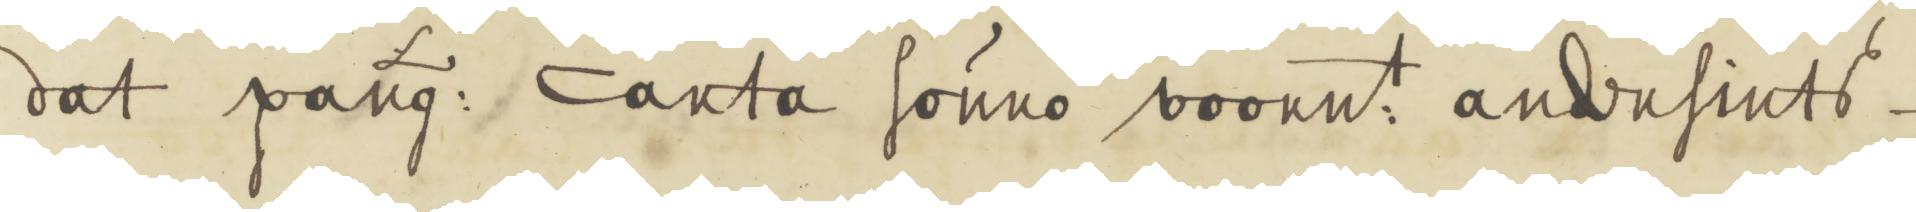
dat pang: carta souro voorn:t andersints
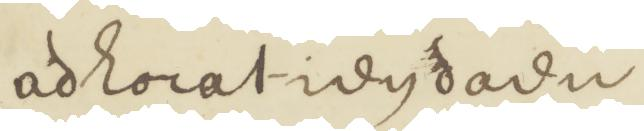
adhoratien doen
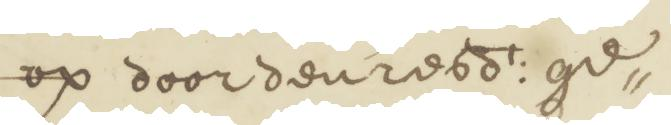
op door den resdt: ge„
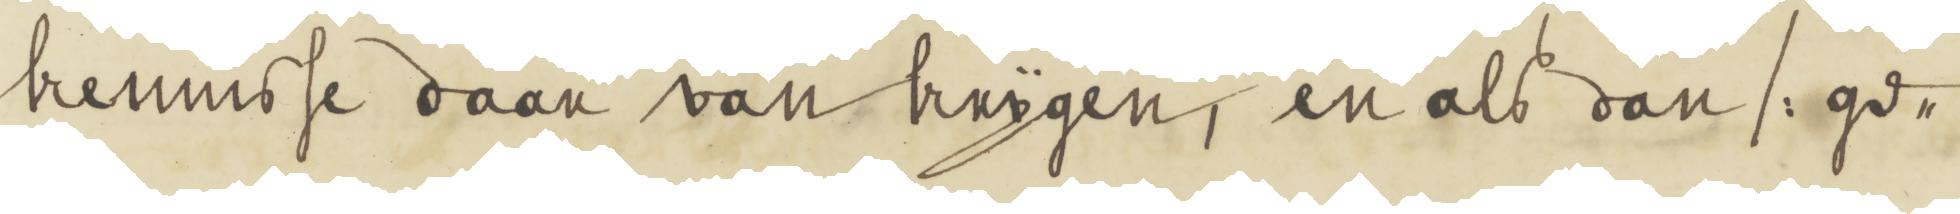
kennisse daar van krijgen, en als dan /: ge„
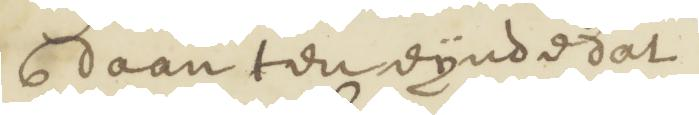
daan ten eijnde dat
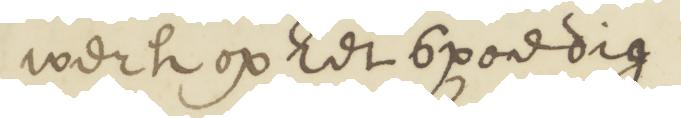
werk op het spoedig
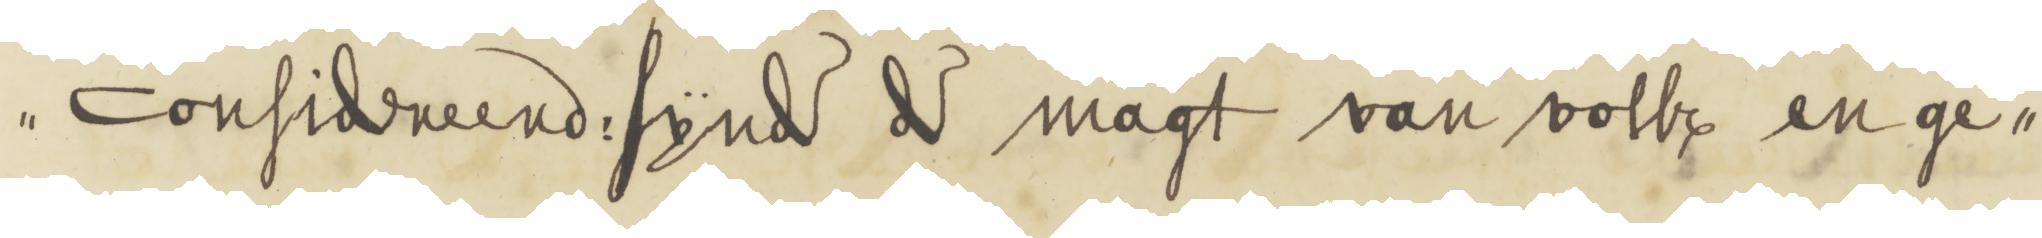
„considereerd: sijnde de magt van volk en ge„
